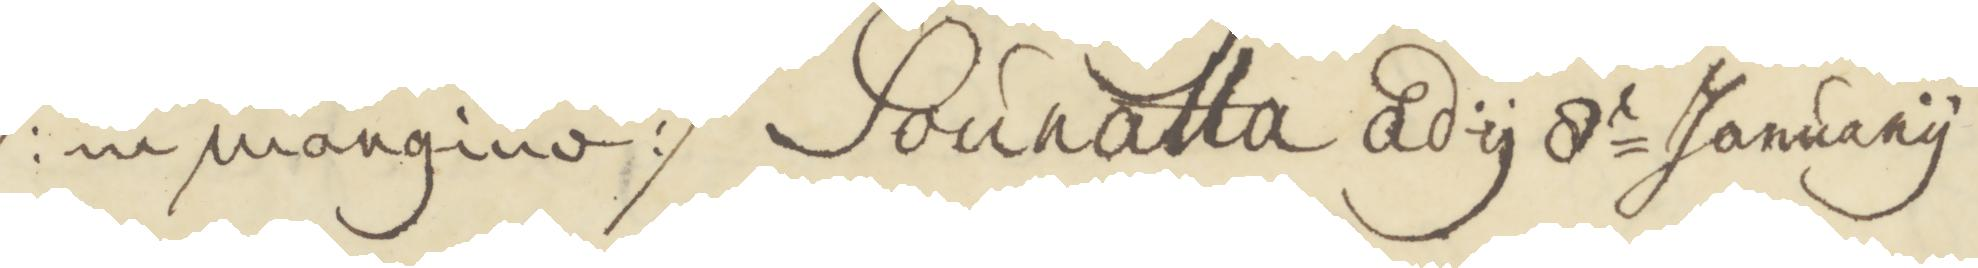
/:in margine:/ Souratta adij 8=e Januarij
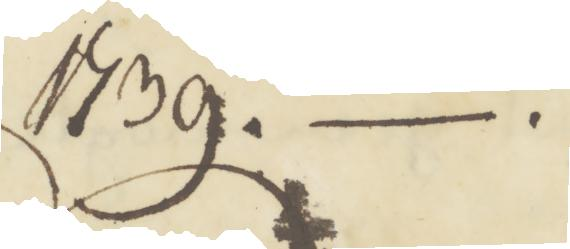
1739. —.
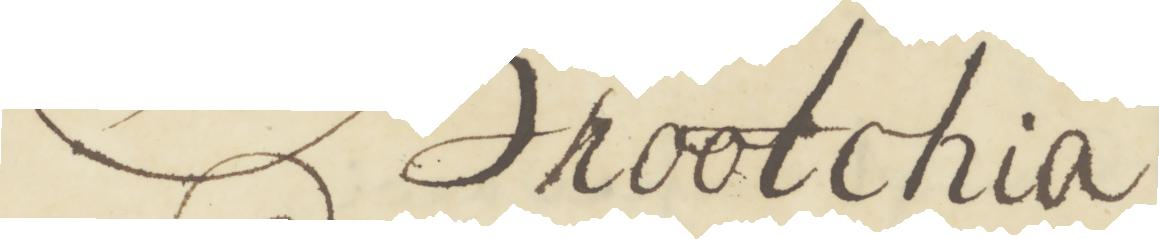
Brootchia
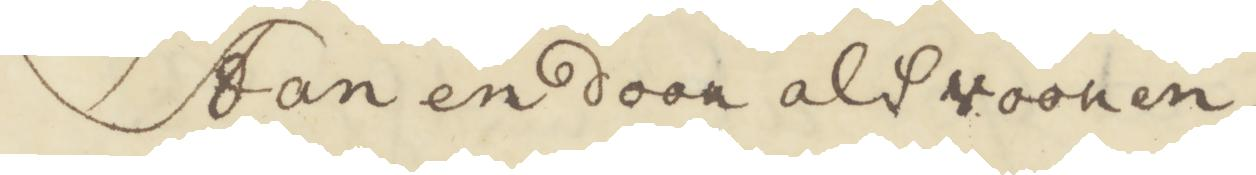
Aan en door als vooren
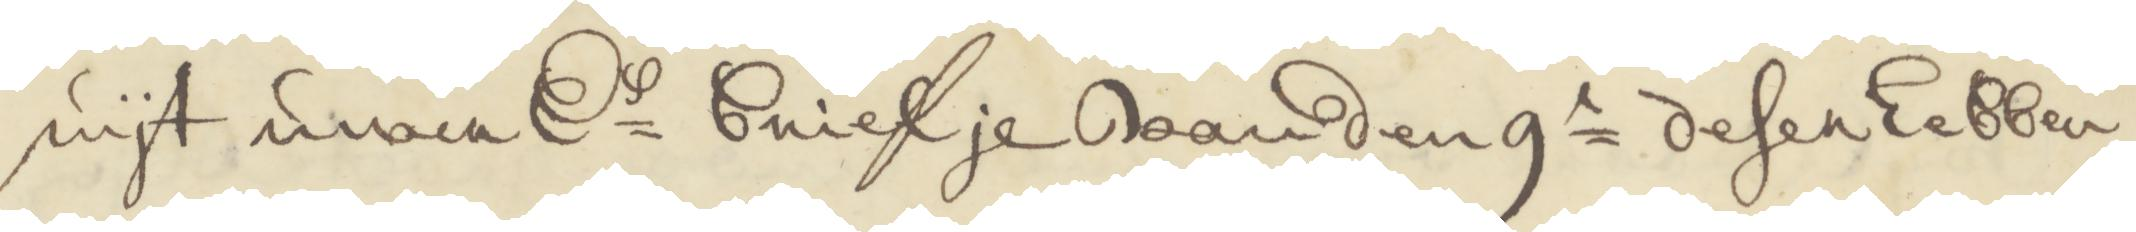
uijt uwer E=s briefje van den 9=e deser hebben
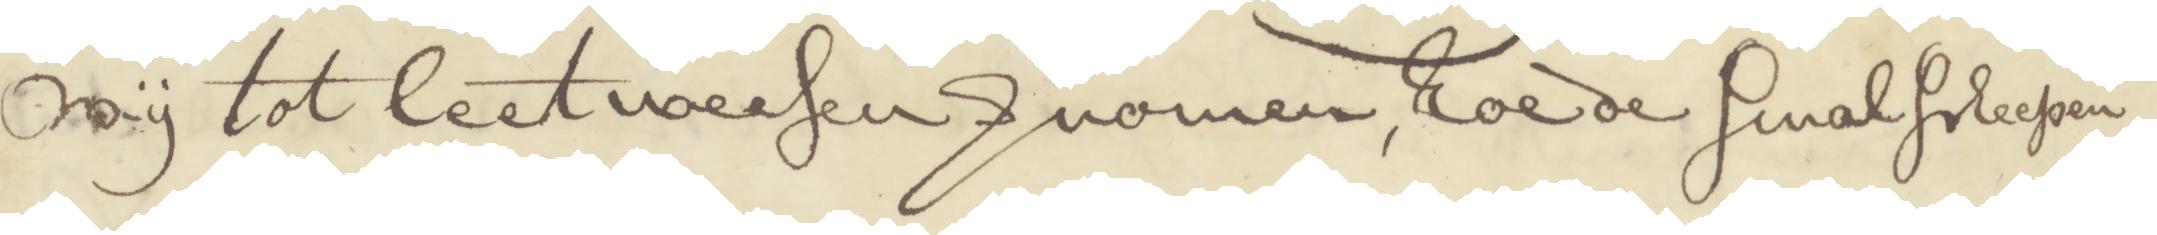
wij tot leet weesen vernomen, hoe de smal scheepen
